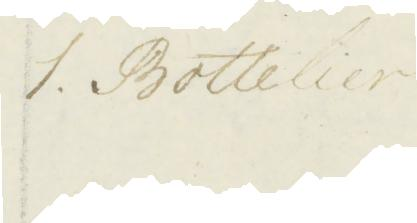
1. Bottelier
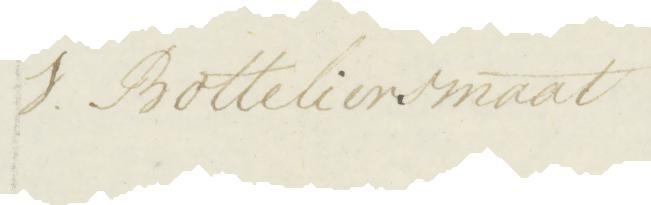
1. Botteliersmaat
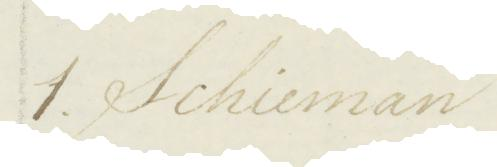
1. Schieman
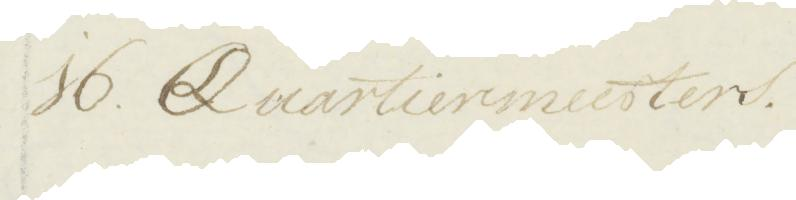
16. Quartiermeesters.
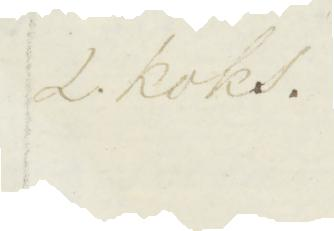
2. koks.
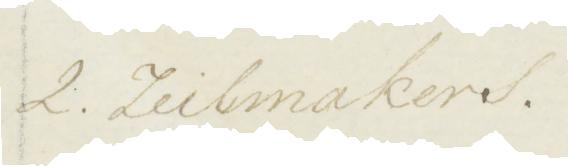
2. zeilmakers.
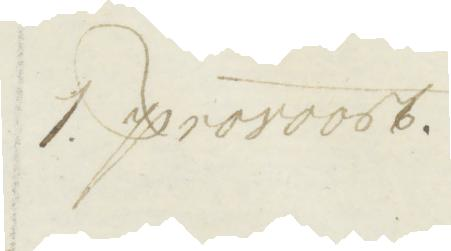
1. provoost.
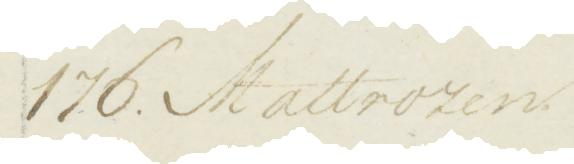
176. Mattrozen.
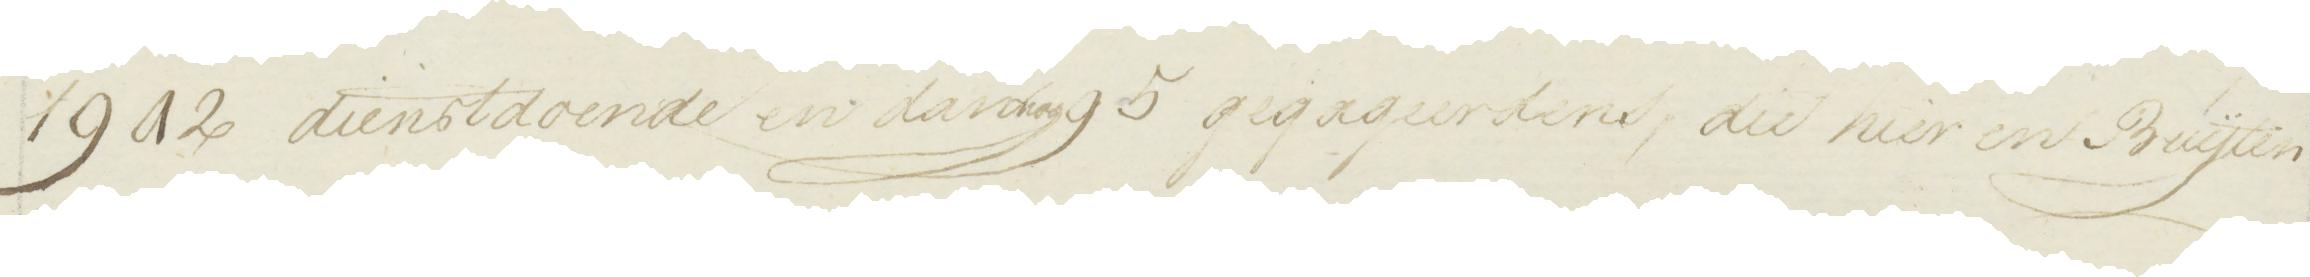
1942 dienstdoende en dan nog 5 gegageerdens, die hier en Buijten
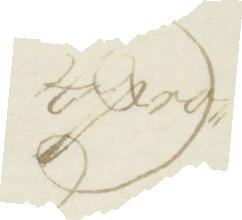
't pro„
